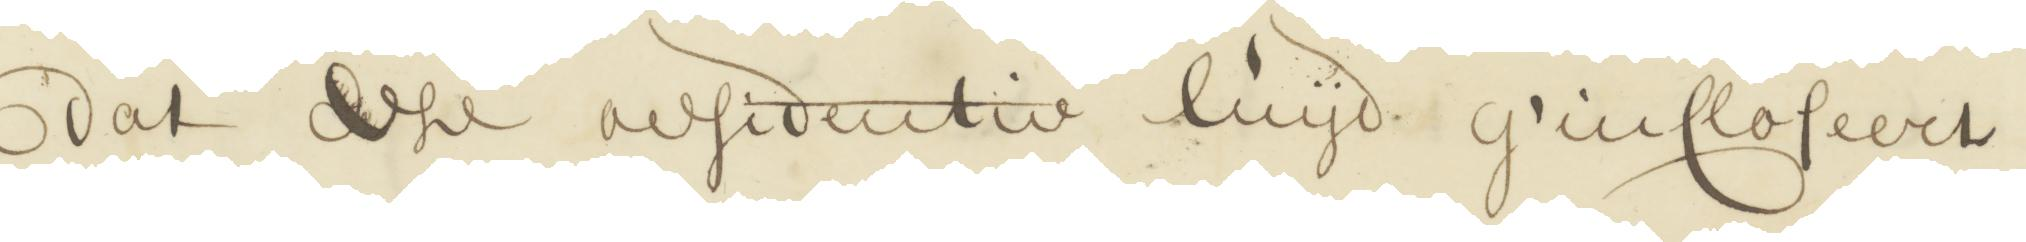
dat dese residentie luijd g’incloseert
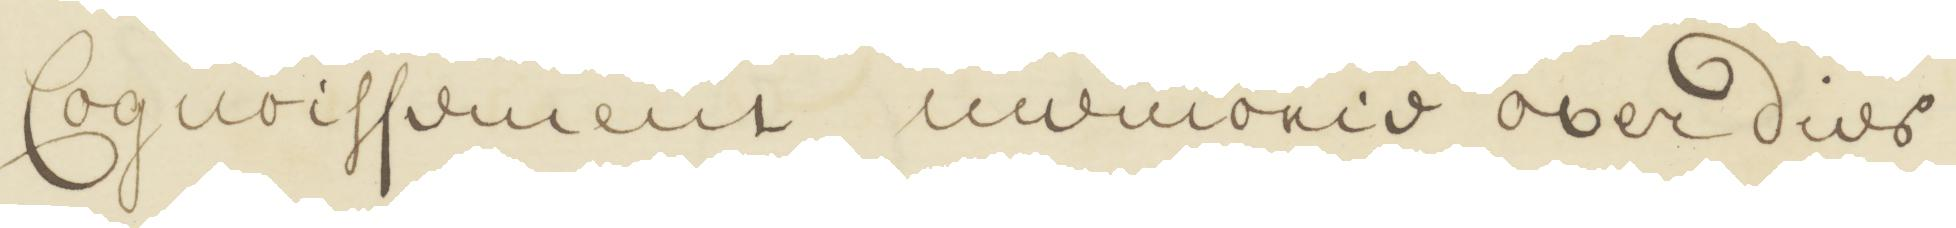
cognoissement memorie over dies
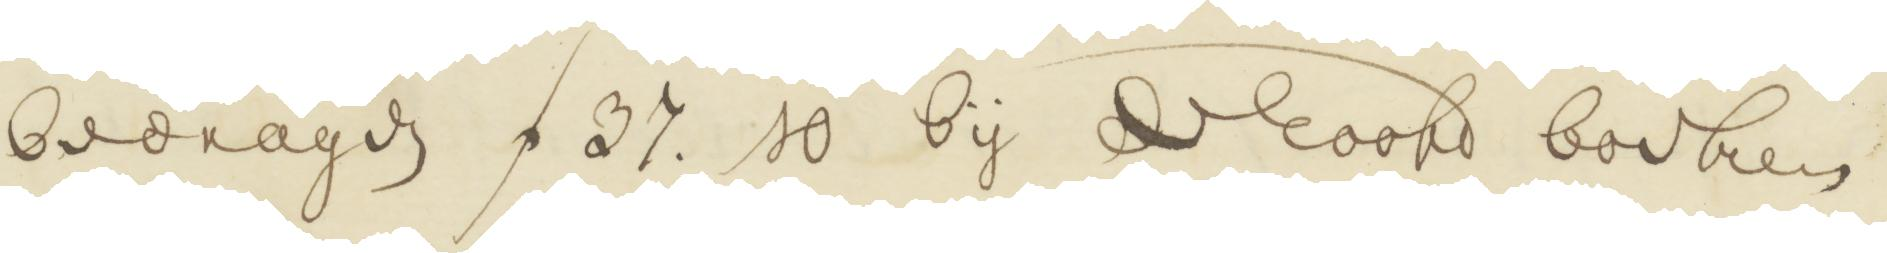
bedragen ƒ 37.10 bij dehoofd boeken
